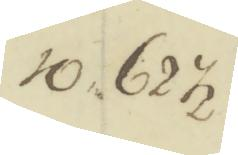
10„62½
